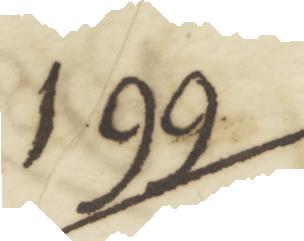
199 /
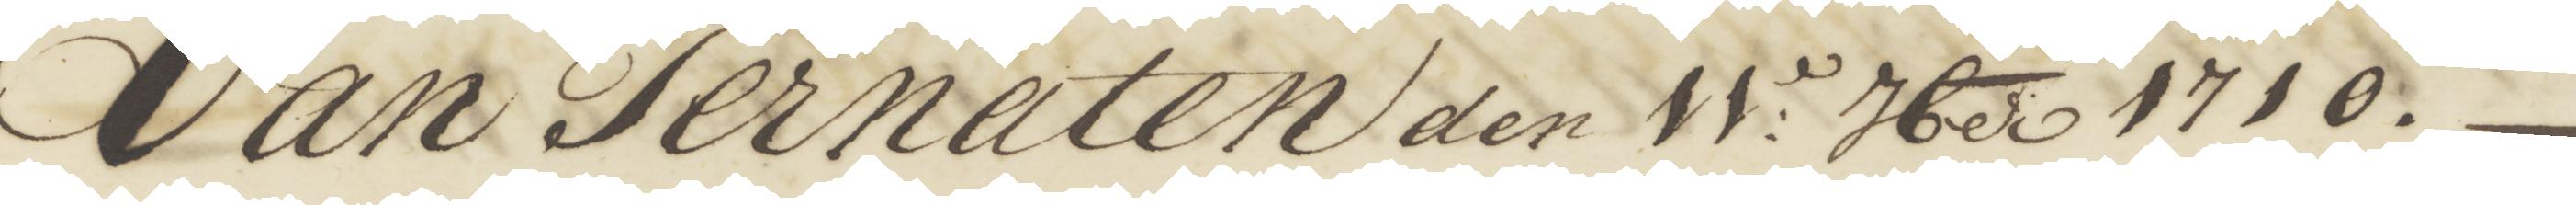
Van Ternaten den 11:' Jber 1710.—
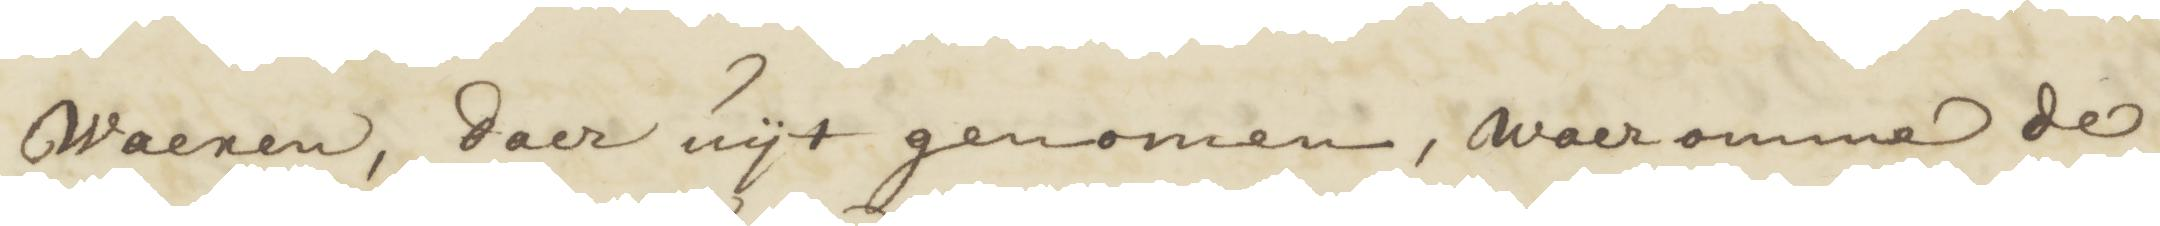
waeren, daer uijt genomen, waer omme de
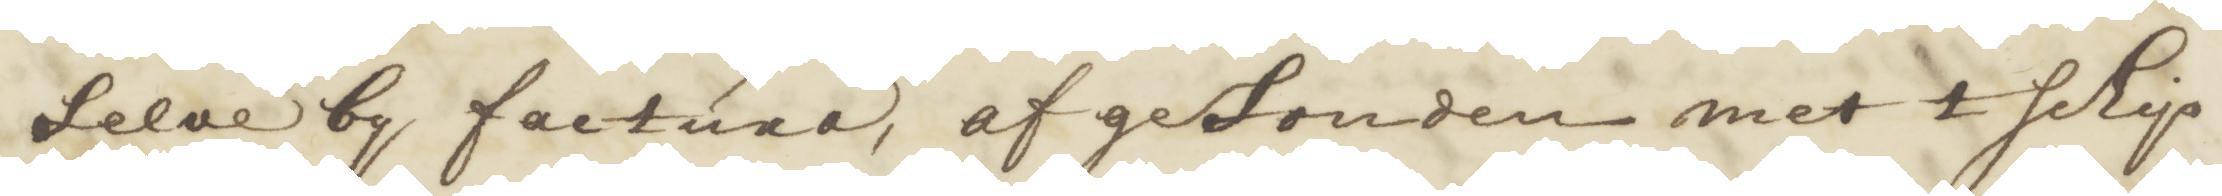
selve by factura, afgesonden met t schip
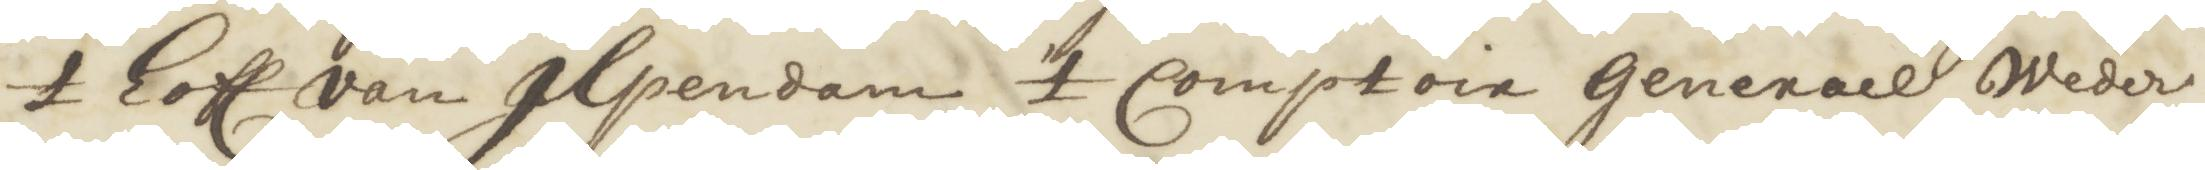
t hoff van Jlpendam ’t Comptoir generael weder
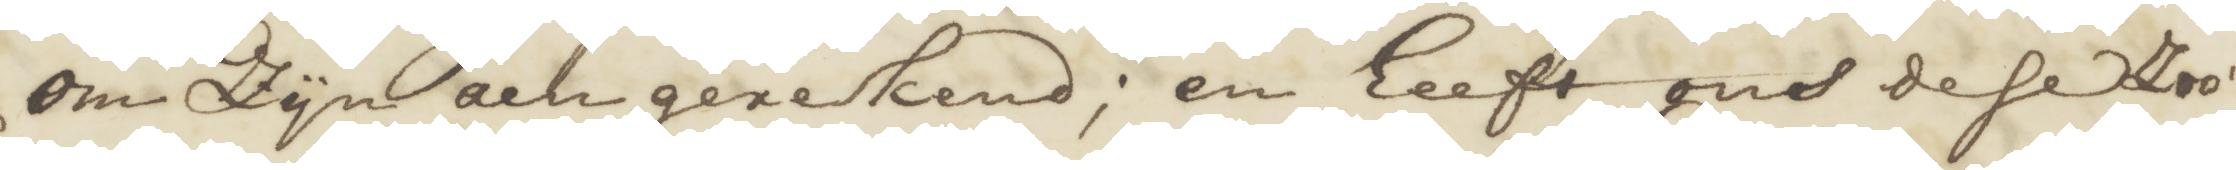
om zijn aen gerekend; en heeft ons dese zoo
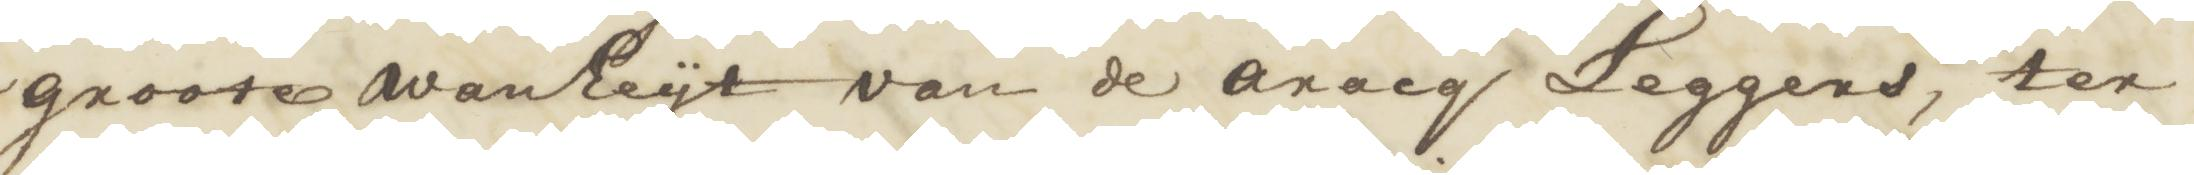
groote wanheijt van de aracq leggers, ter
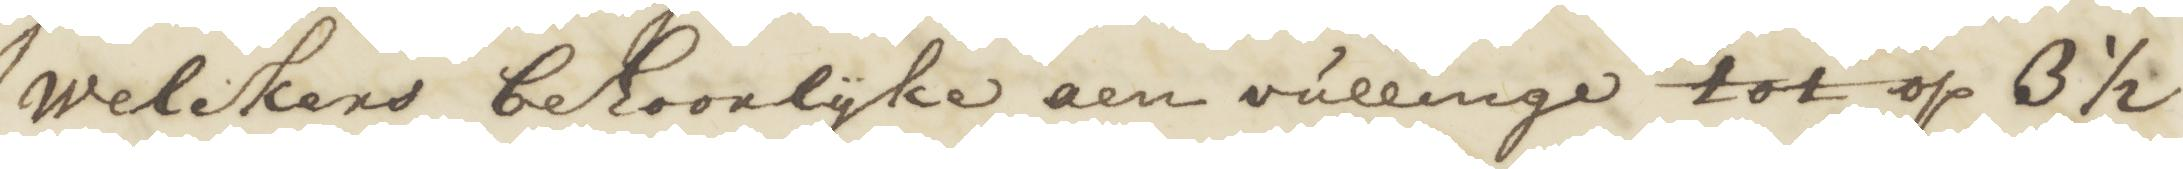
welckers behoorlijke aen vullinge tot op 3½
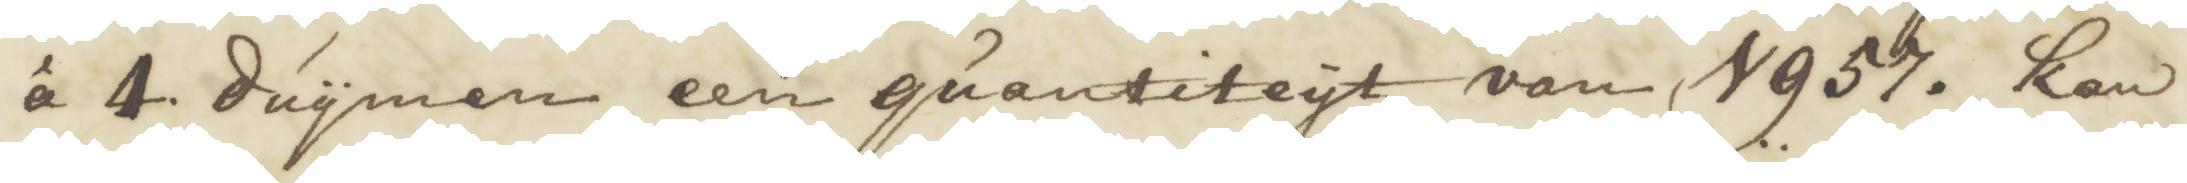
â 4. duijmen een quantiteijt van 1957. kan
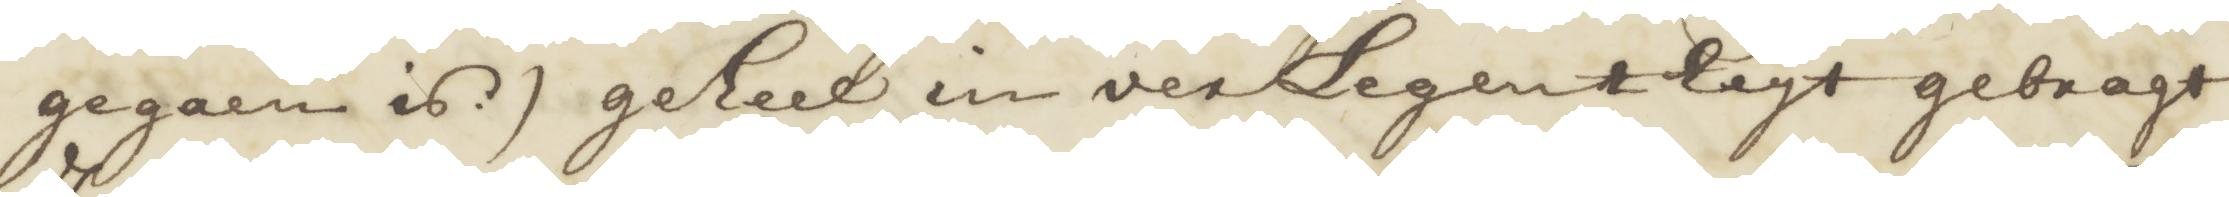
gegaen is:) geheel in verlegentheijt gebragt
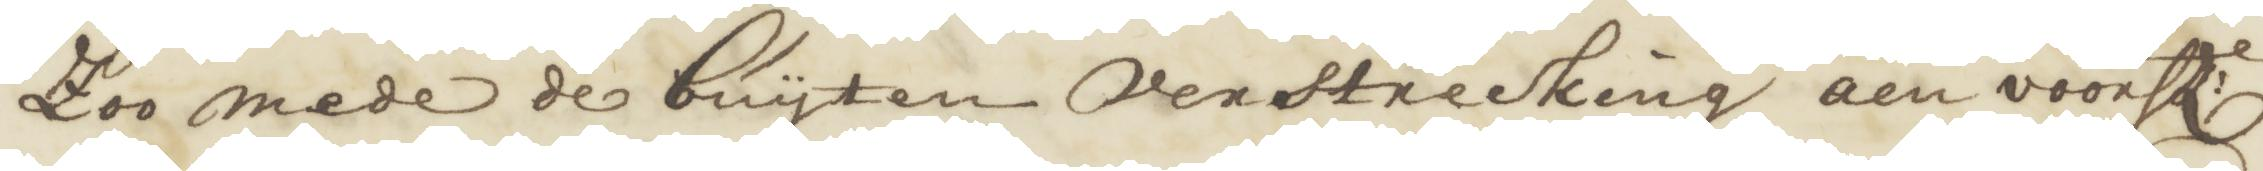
zoo mede de buijten verstrecking aen voorsz:'
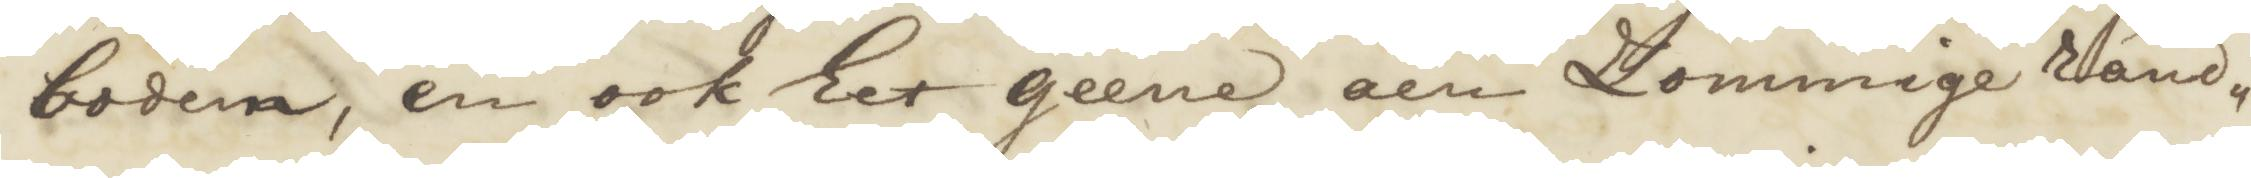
bodem, en ook het geene aen zommige rand„
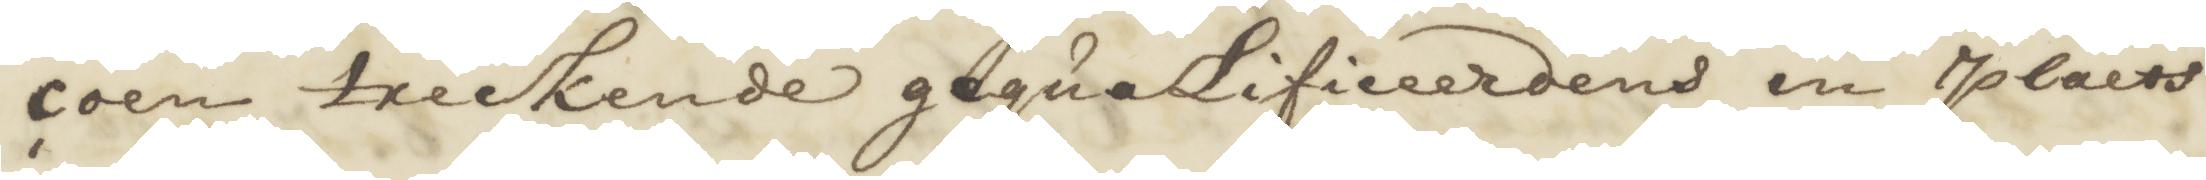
çoen treckende gequalificeerdens in plaets
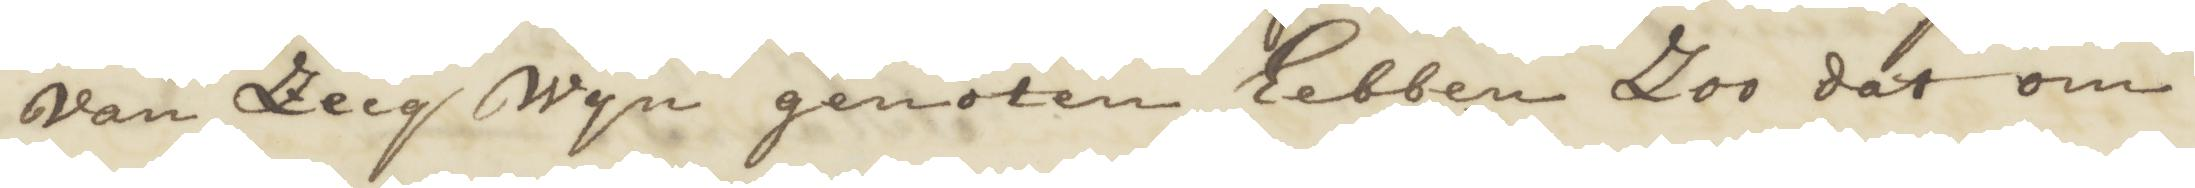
van zecq wyn genoten hebben zoo dat om
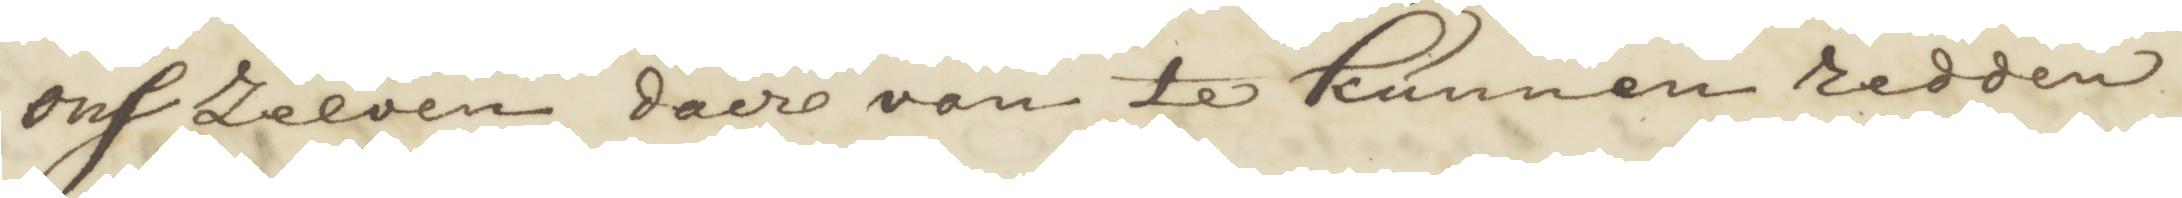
ons zelven daer van te kunnen redden
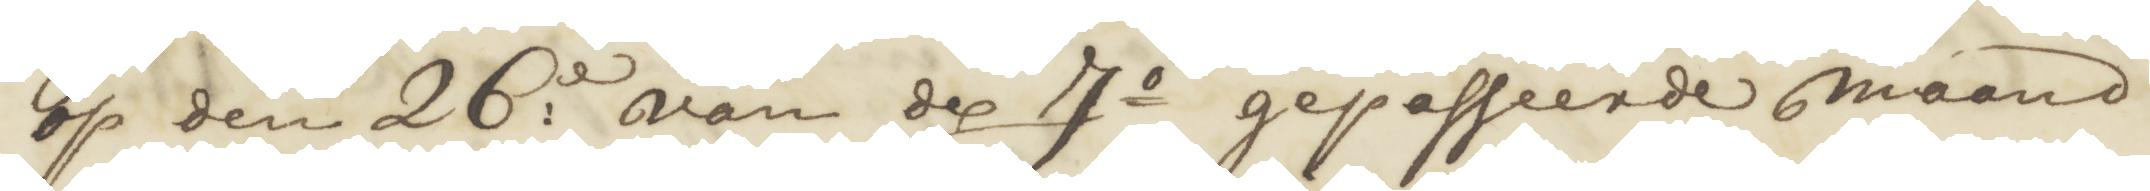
op den 26:' van de J=o gepasseerde maand
